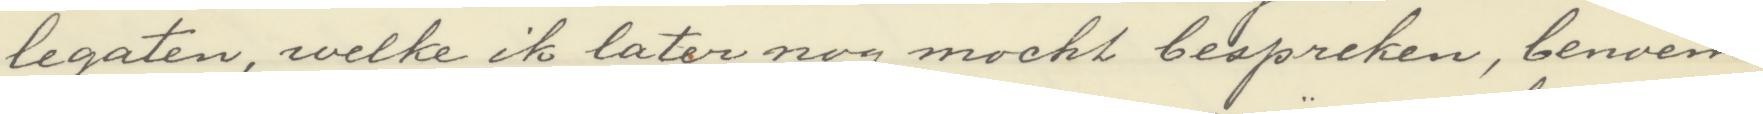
legaten, welke ik later nog mocht bespreken, benoem
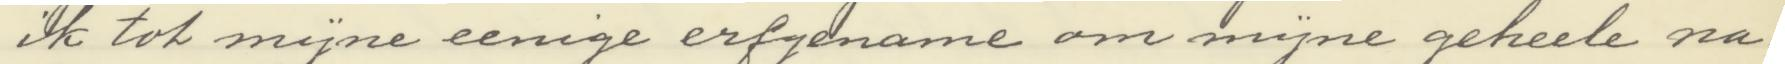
ik tot mijne eenige erfgename om mijne geheele na=
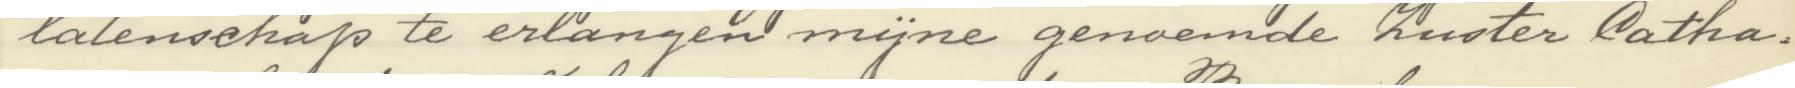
latenschap te erlangen mijne genoemde Zuster Catha=
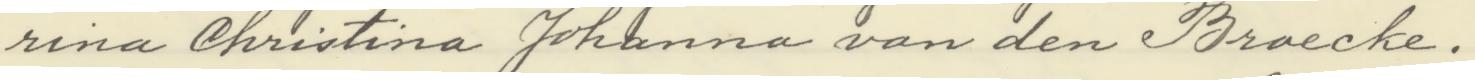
rina Christina Johanna van den Broecke.
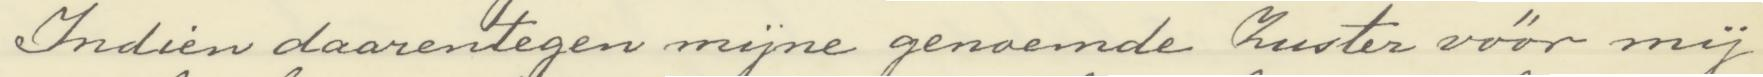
Indien daarentegen mijne genoemde zuster vóór mij
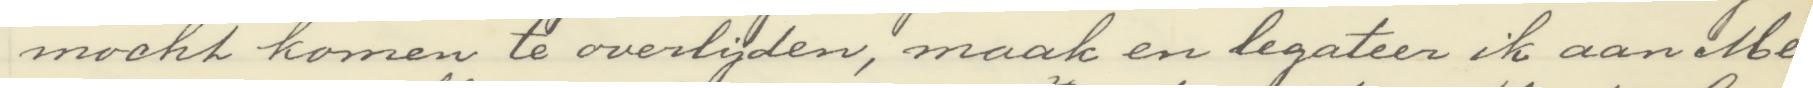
mocht komen te overlijden, maak en legateer ik aan Me
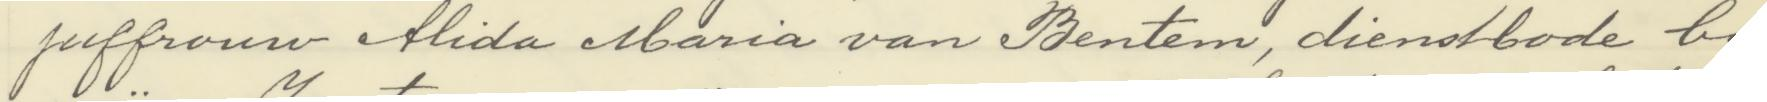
Juffrouw Alida Maria van Bentem, dienstbode bij
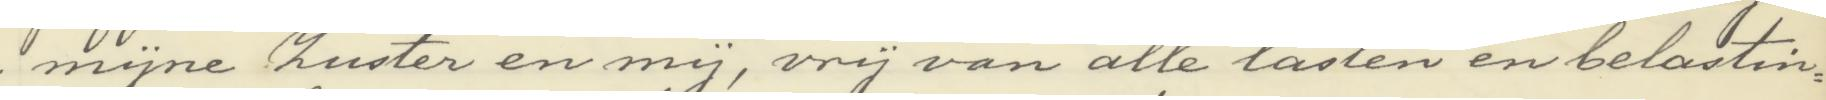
mijne zuster en mij, vrij van alle lasten en belastin„
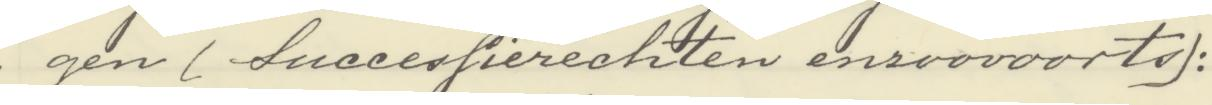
gen ( successierechten enzoovoorts):
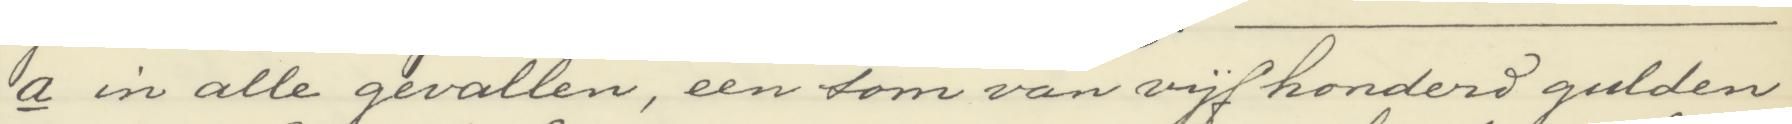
a in alle gevallen, een som van vijf honderd gulden
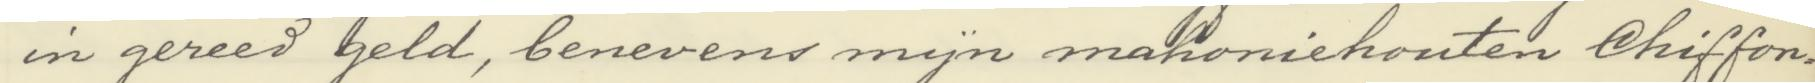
in gereed geld, benevens mijn mahoniehouten Chiffon„
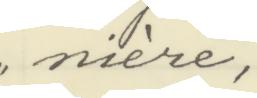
„nière,
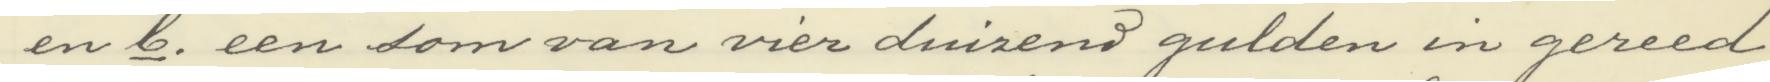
en b. een som van vier duizend gulden in gereed
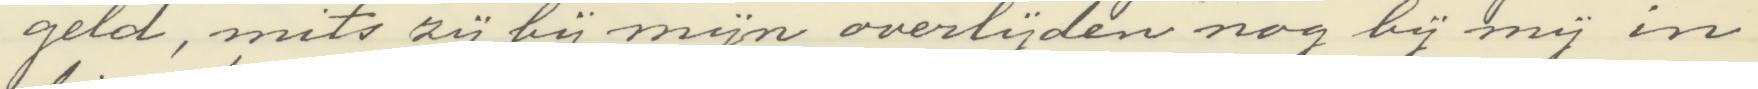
geld, mits zij bij mijn overlijden nog bij mij in
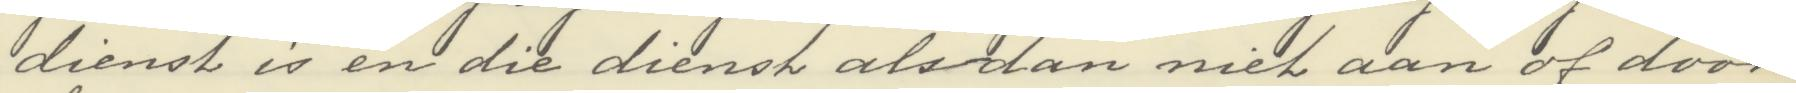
dienst is en die dienst alsdan niet aan of door
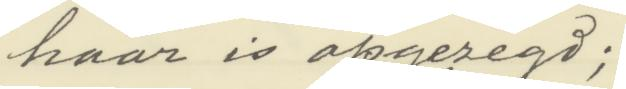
haar is opgezegd;
